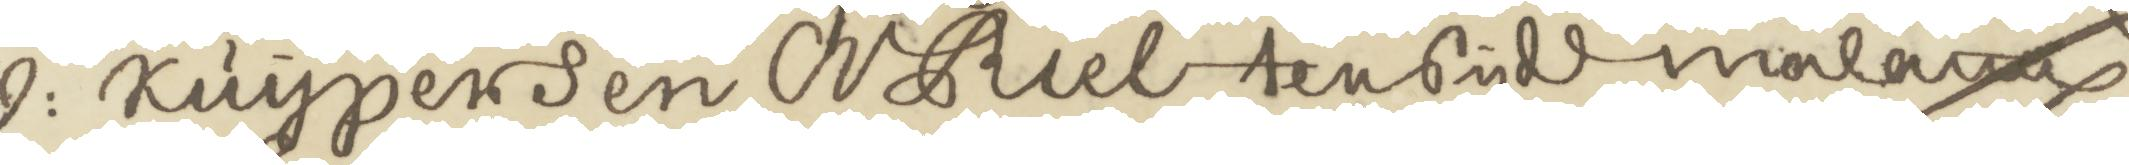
9: kuijpers en CV Riel tersijde malacca
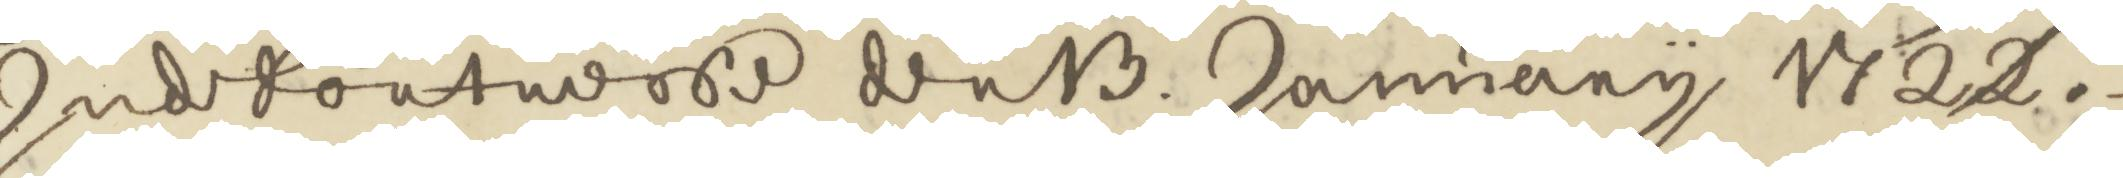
jnde fortresse den 13: januarij 1722.
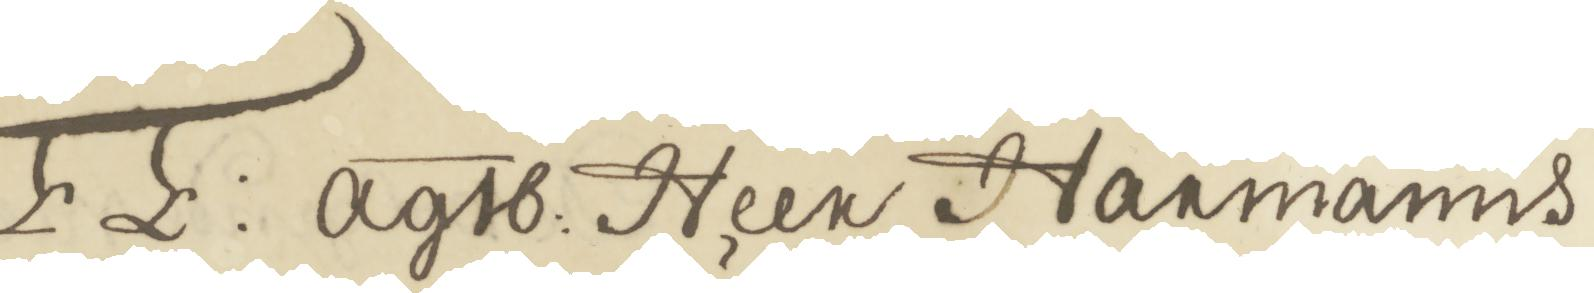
E E: agtb: Heer Harmanus
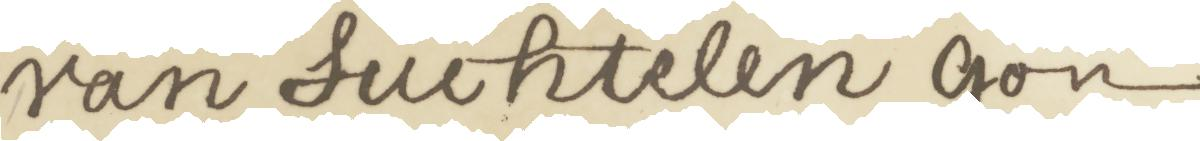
van suchtelen gou„
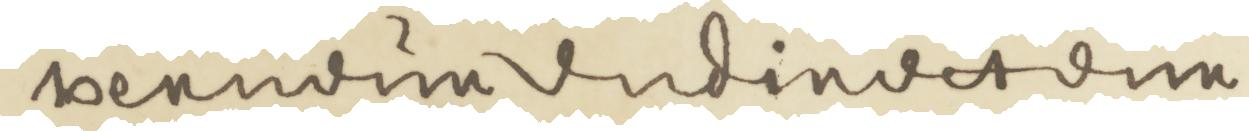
verneur en directeur
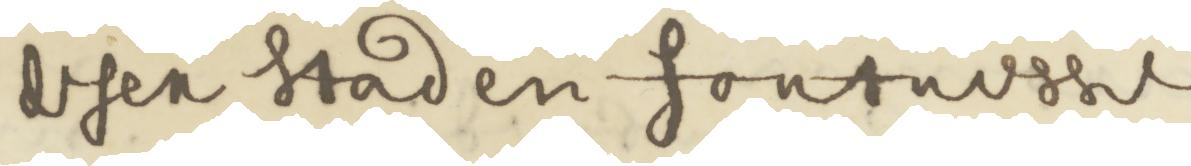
deser stad en fortresse
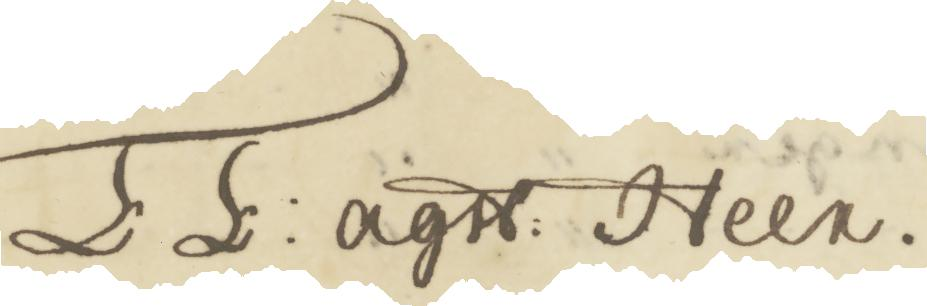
E E: agtb: Heer.
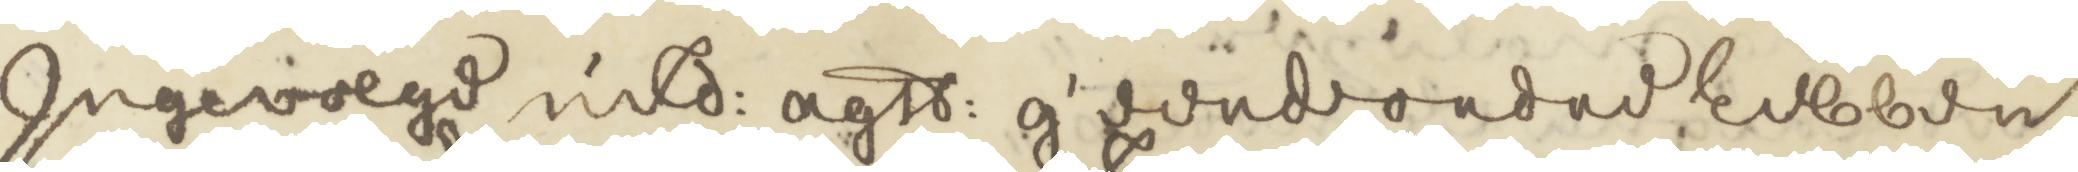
jngevolge u Ed: agtb: g’eerde ordre hebben
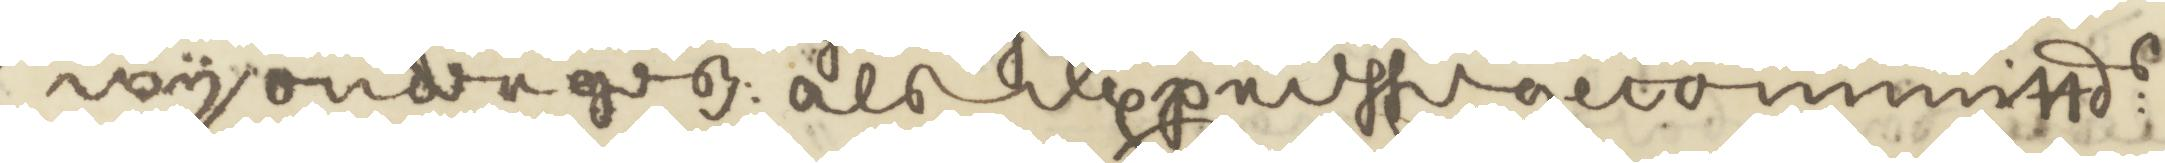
wij onder gesz: als expresse gecommittd:s
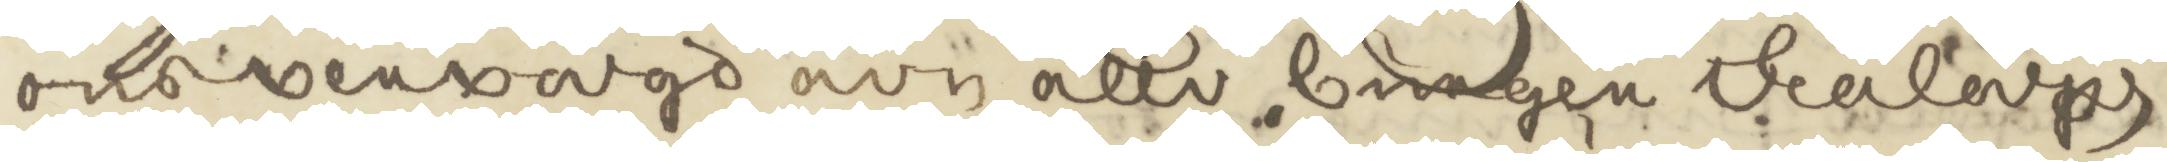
ons vervoegd aan alle burger chaloepen
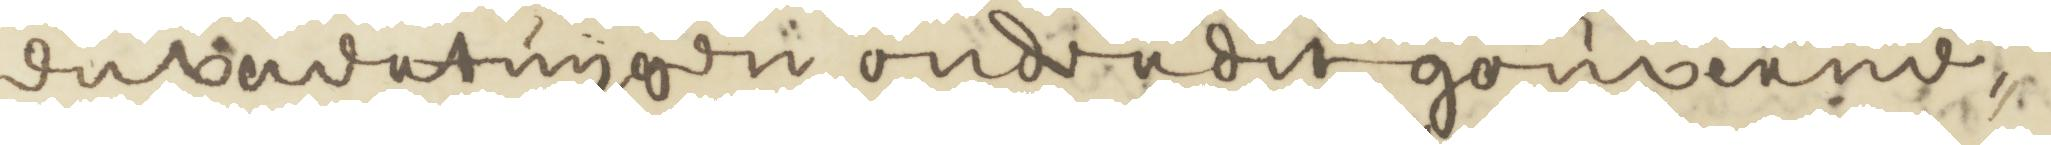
en vaertuijgen onder dit gouverne„
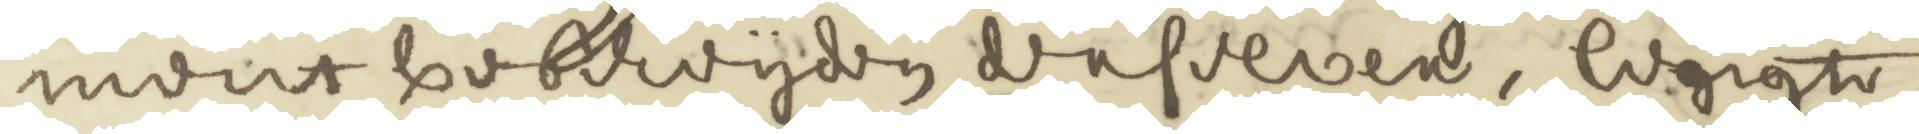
ment bescheijden derselver, lengte,
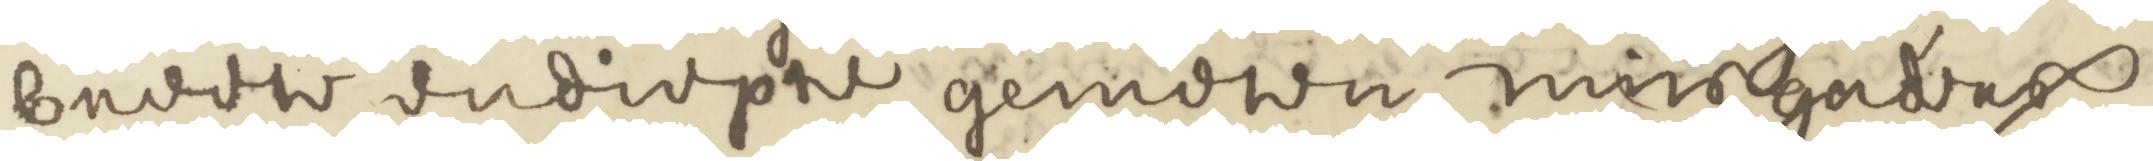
breete, en diepte gemeten, mitsgaders
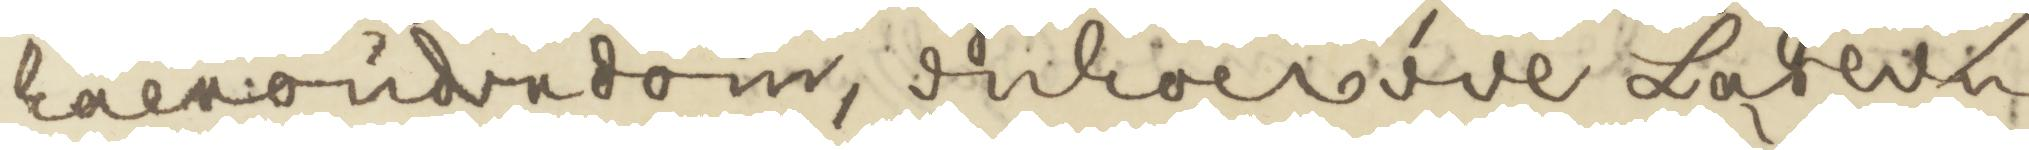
haer ouderdom, en hoeveel lasten
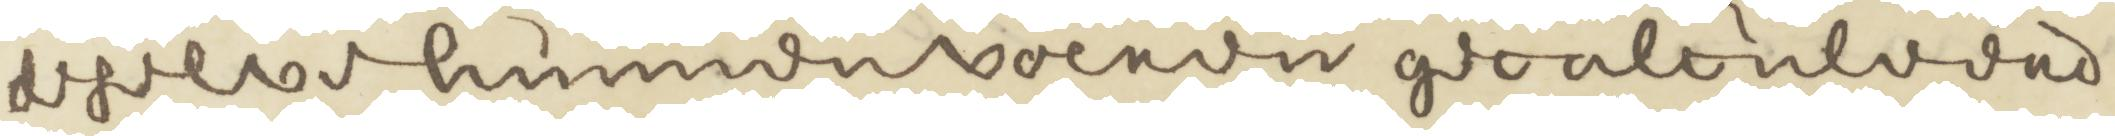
deselve kunnen voeren gecalculeerd
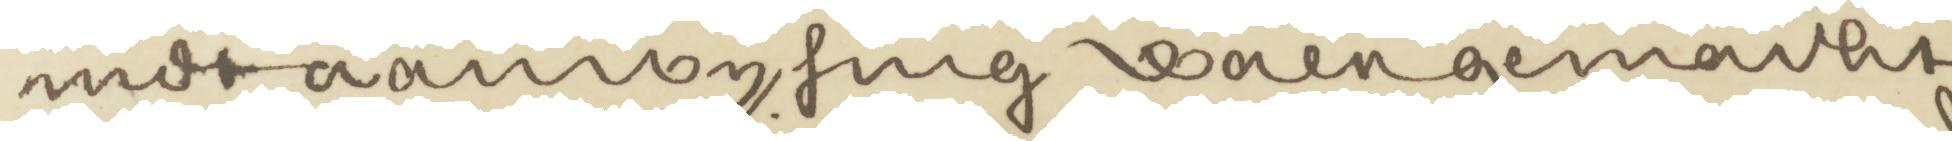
met aanwijsing waer gemaekt
